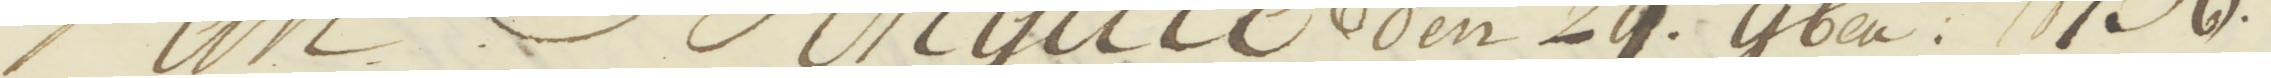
Van Bengale den 24:' 9ber: 1736. —
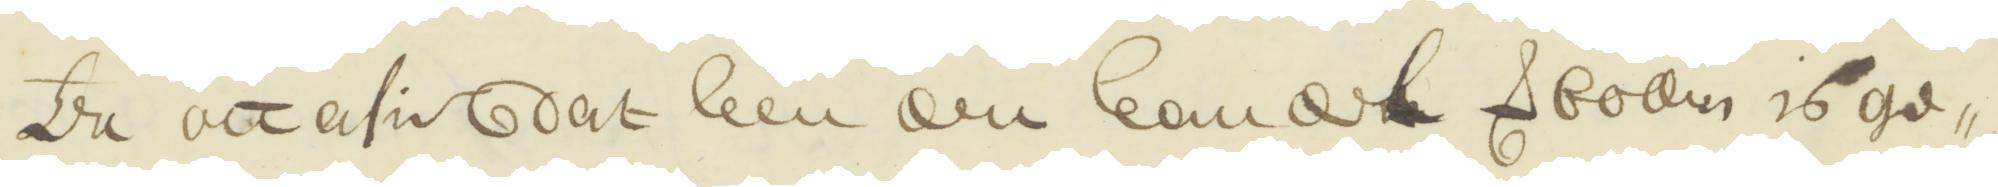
ter occasie dat hen den handel verboden is ge„
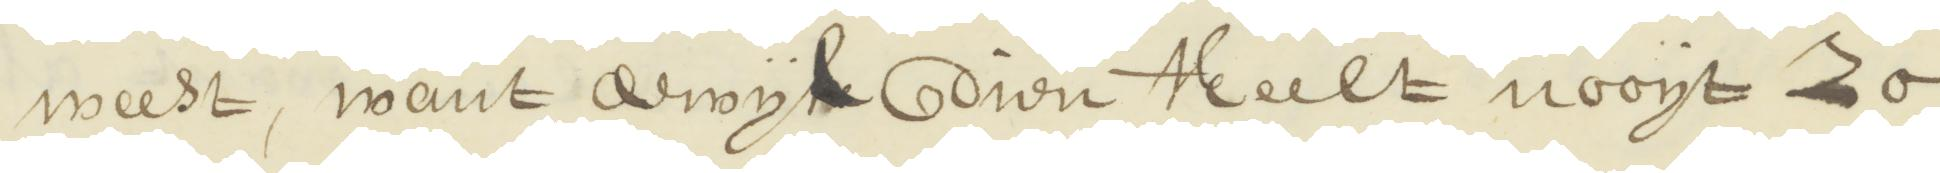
weest, want dewijl dien theelt nooijt zo
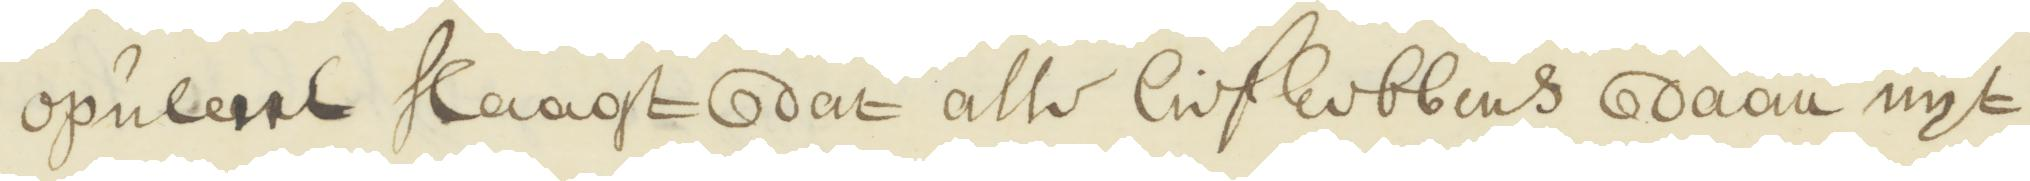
opulent slaagt dat alle liefhebbers daar uijt
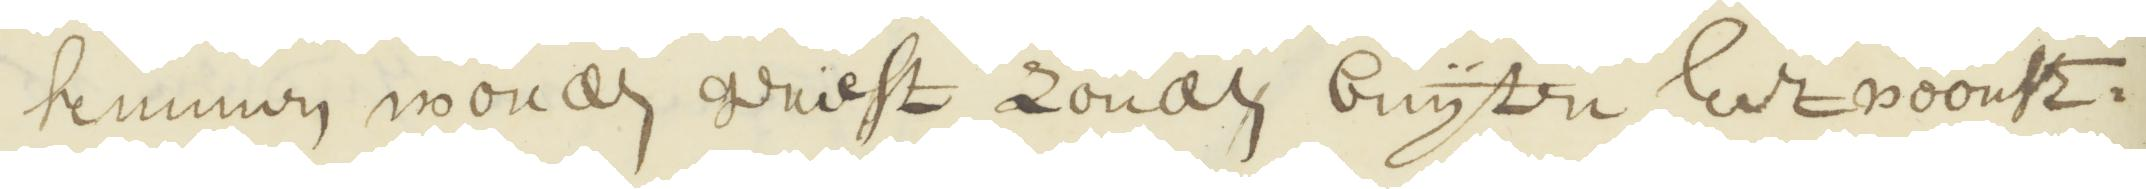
kunnen worden gerieft zouden buijten het voorsz:
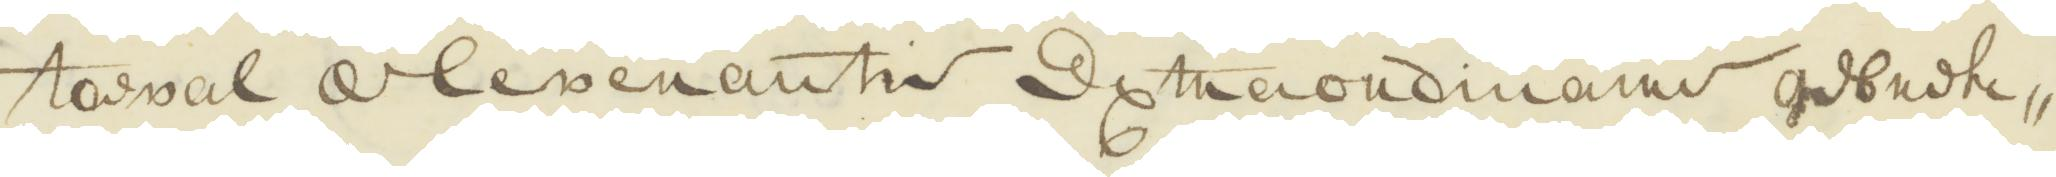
toeval de leverantie Extraordinaire gebrek„
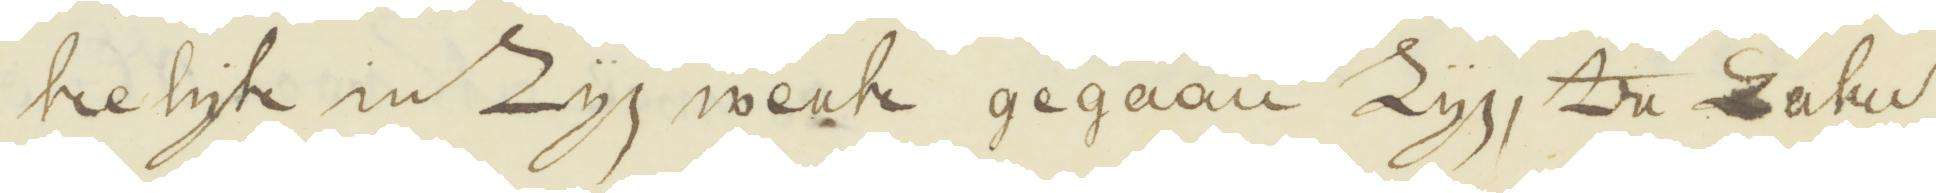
kelijk in zijn werk gegaan zijn, ter zake
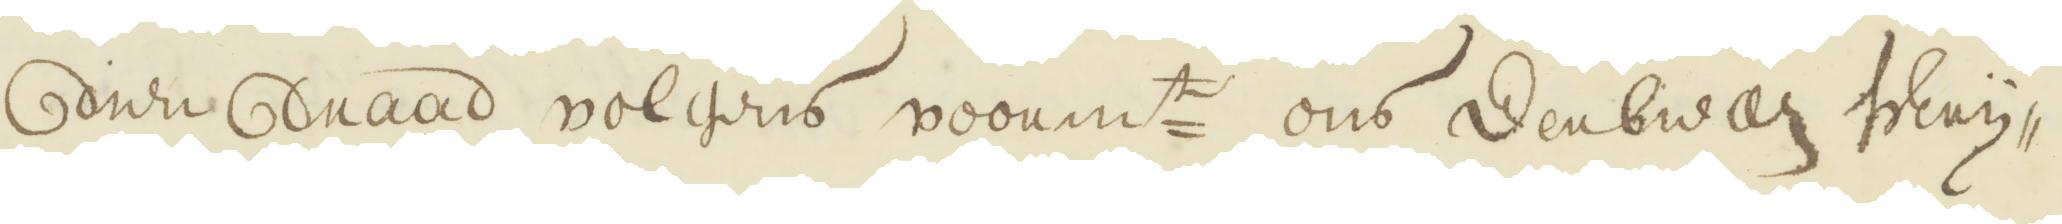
dien draad volgens voorm=te ons Eerbieden schrij„
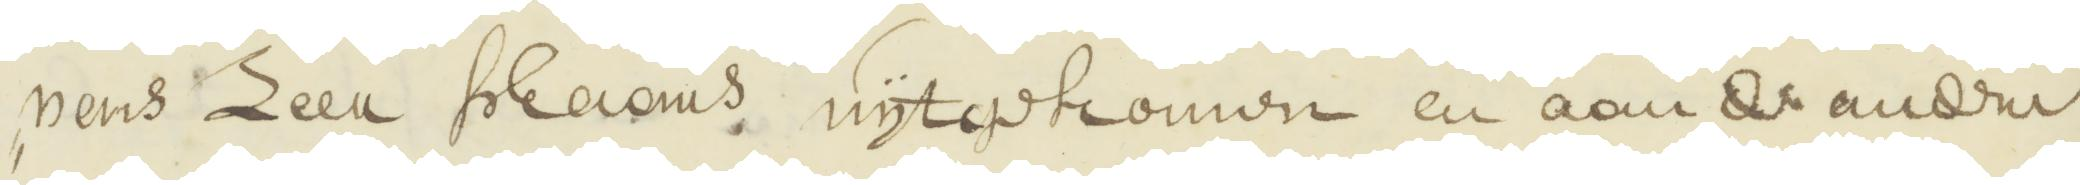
„vens zeer schaars uijtgekomen en aan de andere
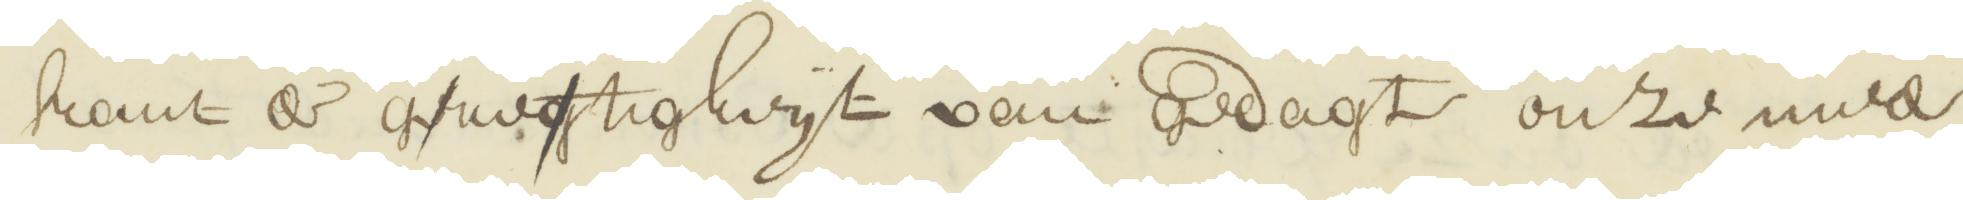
kant de gretigheijt van gedagte onze mede
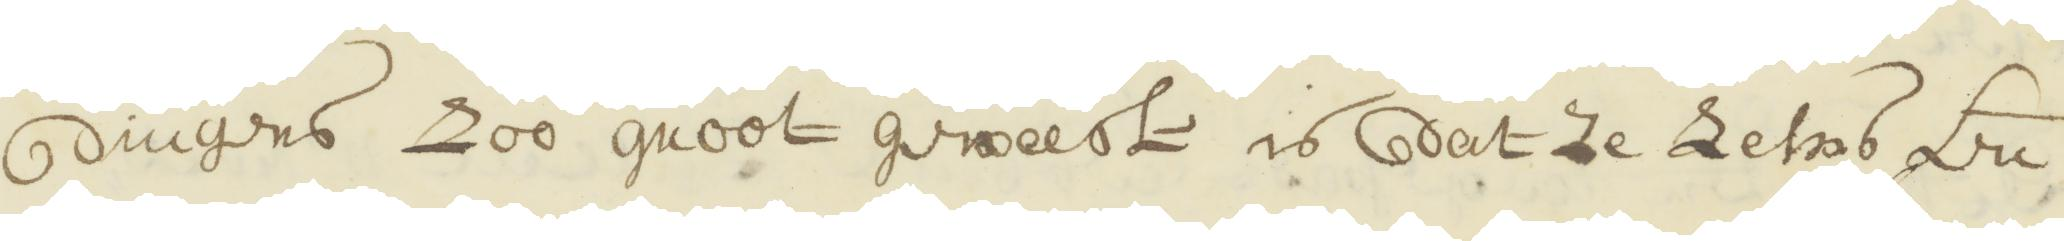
dingers zoo groot geweest is dat ze zelvs ter
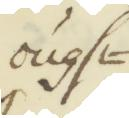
ougst
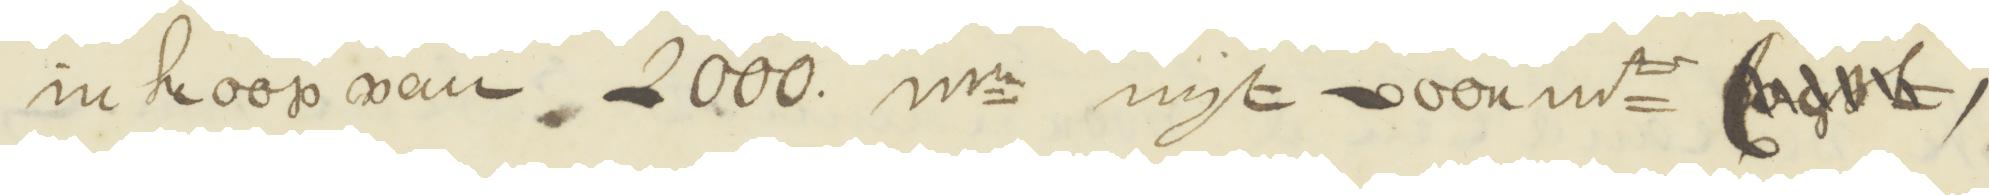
in koop van 2000. m=r uijt voorm=te Cogst,
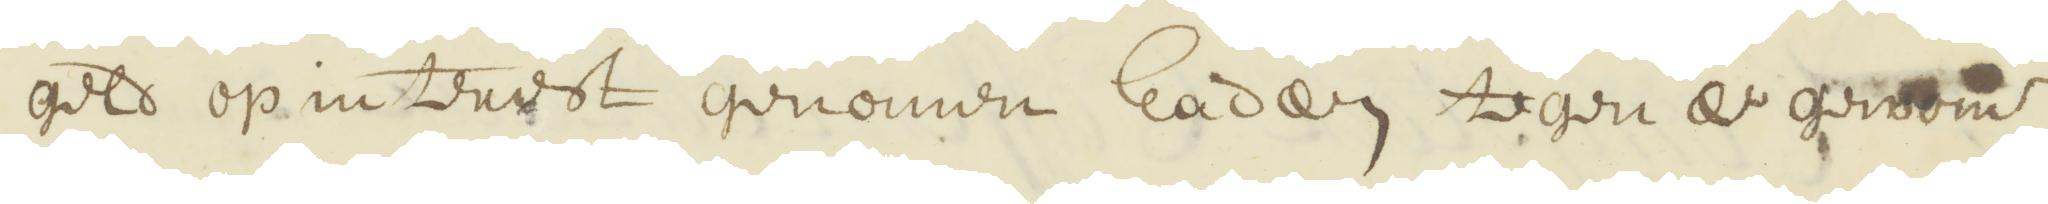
geld op interest genomen hadden tegen de gewone
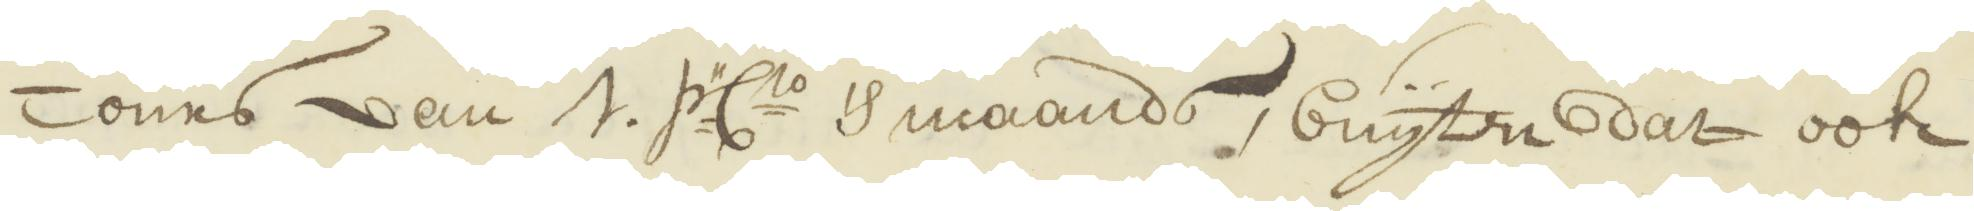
cours van 1. p=r C=to 's maands, buijten dat ook
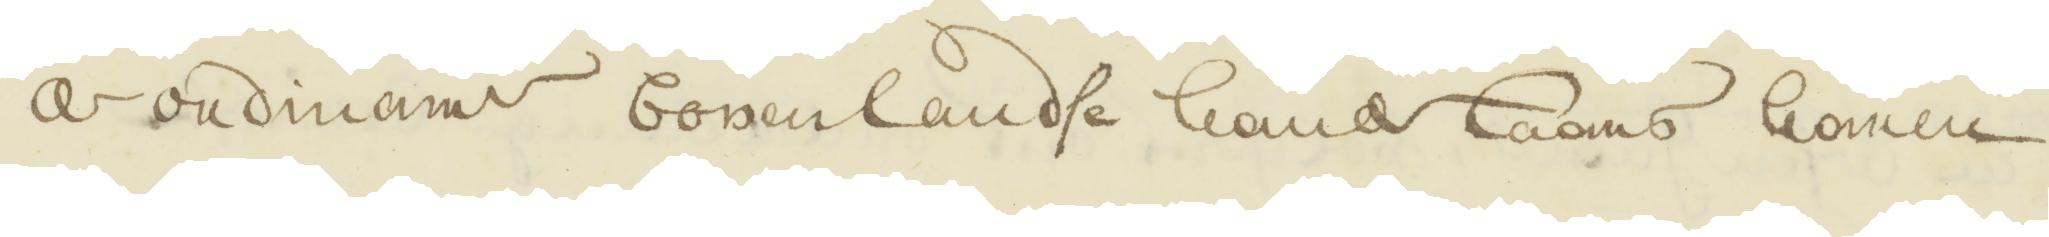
de ordinair bovenlandse handelaars komen
